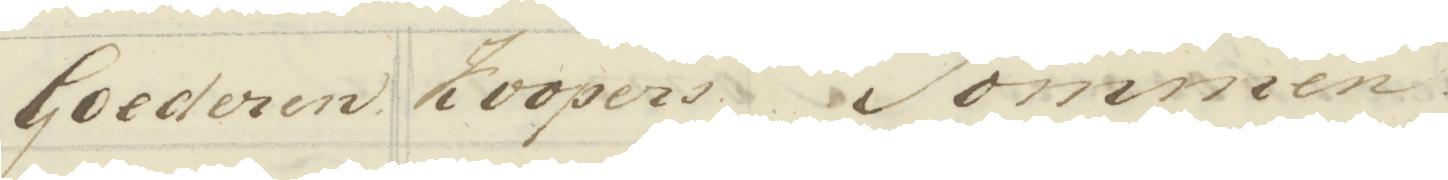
Goederen Koopers Sommen
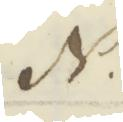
N:
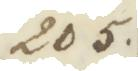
205.
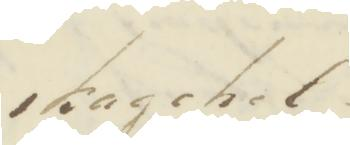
„kagchel
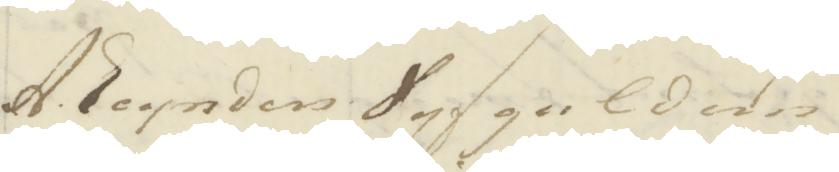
A. Eeynden Vyf gulden
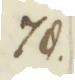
78.
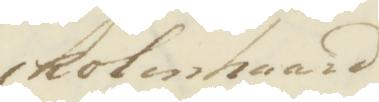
kolenhaard
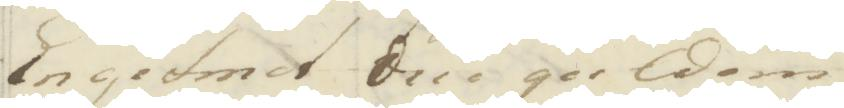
Engesmet drie gulden
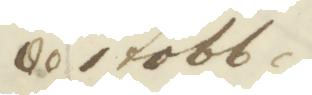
80 1tobb
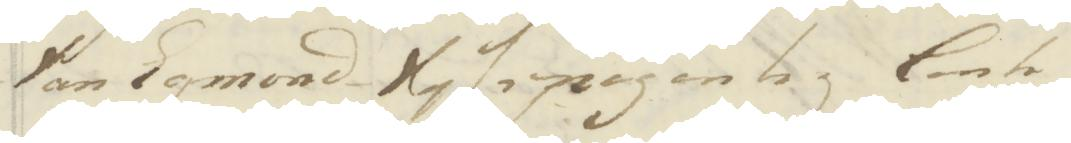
Van Egmond Vyfennegentig Cent
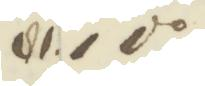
81.1 do
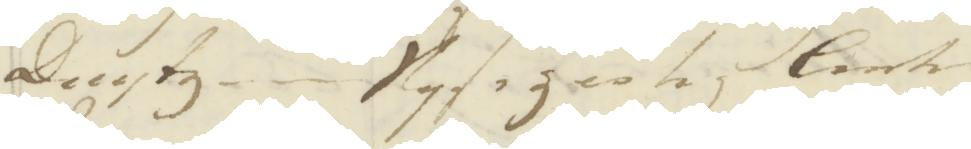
Duyth— Vyfenzestig Cent
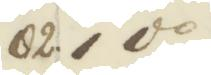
82.1 d.o
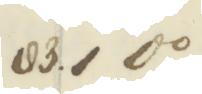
83.1 do
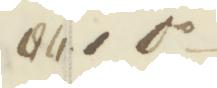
84 1 d=o
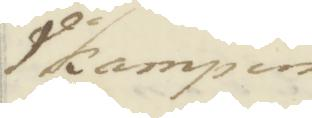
V Kampen
